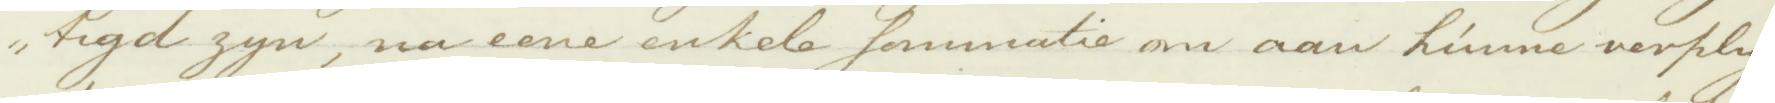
„tigd zyn, na eene enkele sommatie om aan hunne verplig
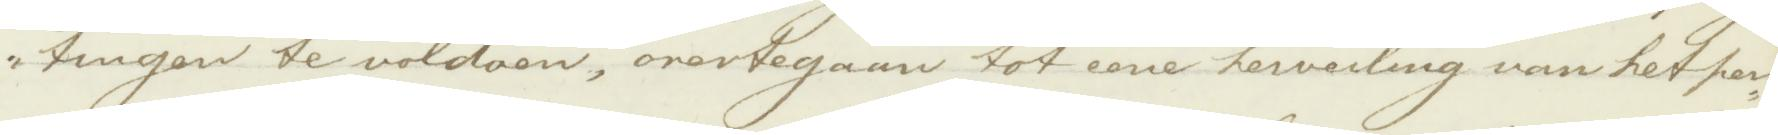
„tingen te voldoen, overtegaan tot eene herveiling van het per„
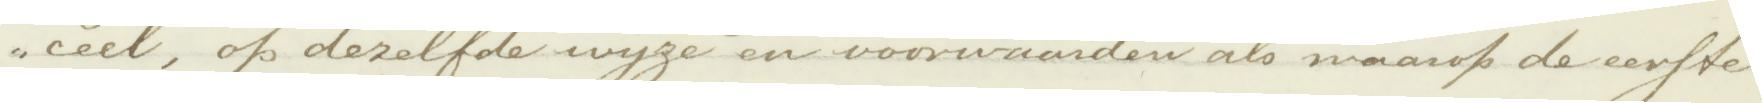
„ceel, op dezelfde wyze en voorwaarden als waarop de eerste
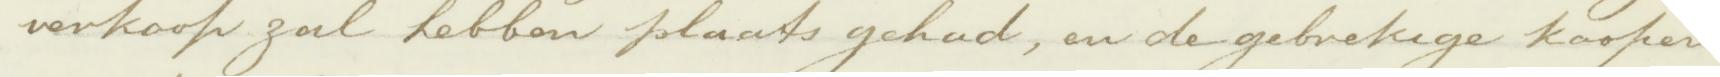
verkoop zal hebben plaats gehad, en de gebrekige kooper
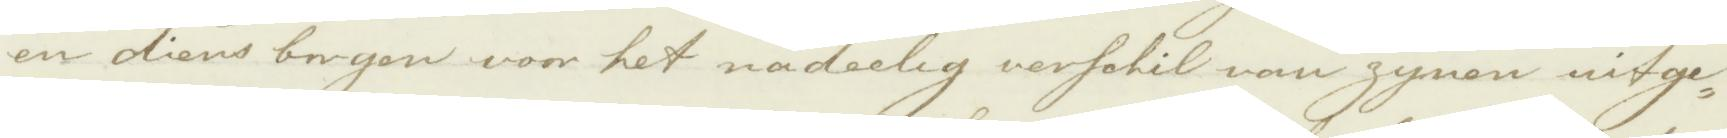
en diens borgen voor het nadeelig verschil van zynen uitge„
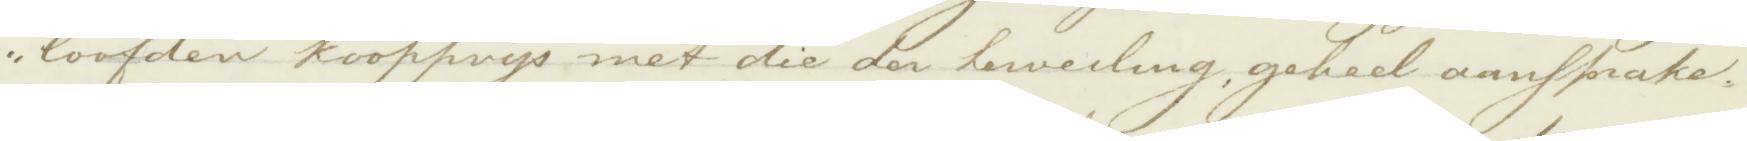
„loofden koopprijs met die der herveiling, geheel aansprake.
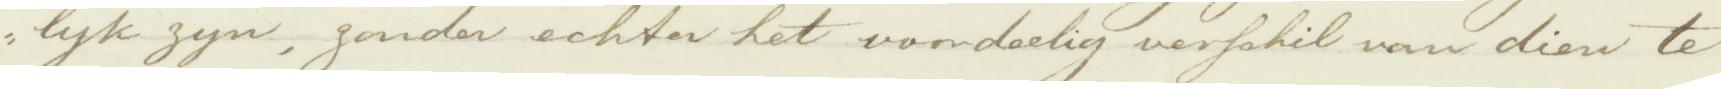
lyk zyn, zonder echter het voordeelig verschil van dien te
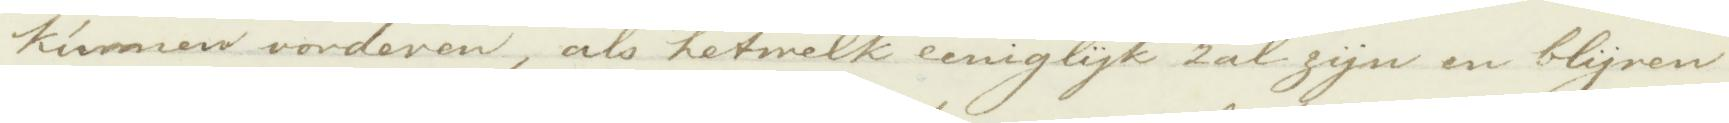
kunnen vorderen, als hetwelk eeniglijk zal zijn en blijven
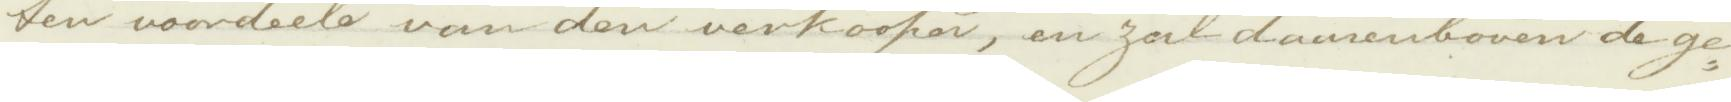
ten voordeele van den verkooper, en zal daarenboven de ge=
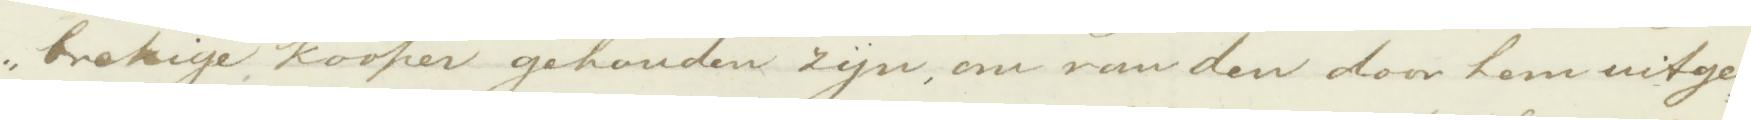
brekige kooper gehouden zijn, om van den door hem uitge=
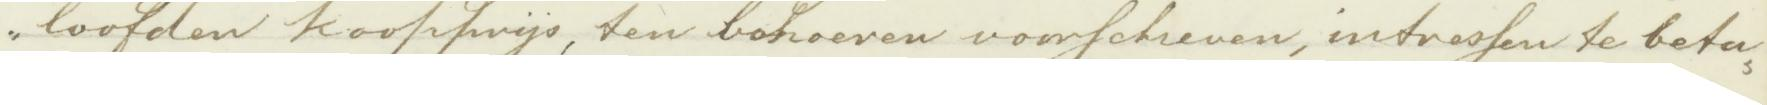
„loofden koopprijs, ten behoeven voorschreven, intressen te beta=
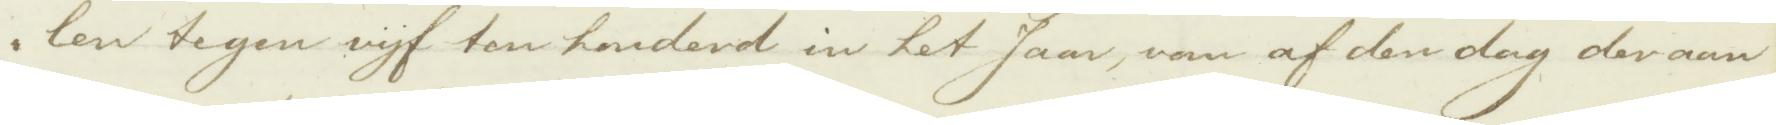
„len tegen vijf ten honderd in het Jaar, van af den dag der aan
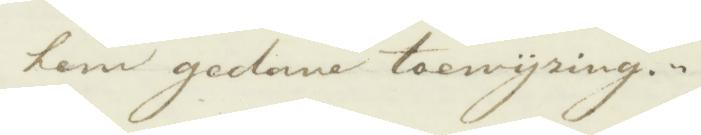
hem gedane toewijzing. -
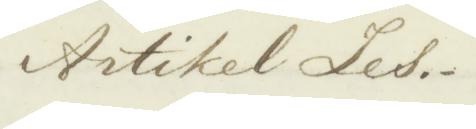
Artikel Zes. -
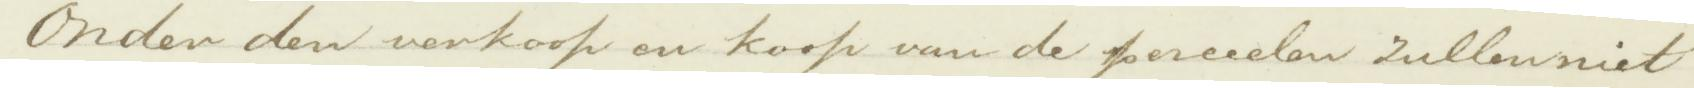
Onder den verkoop en koop van de perceelen zullen niet
